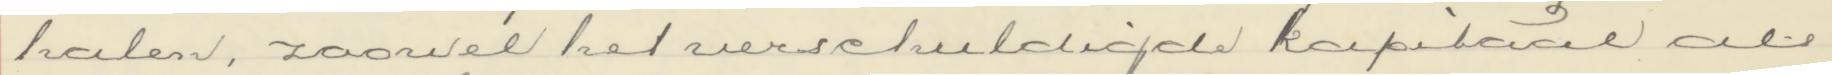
halen, zoowel het verschuldigde kapitaal als
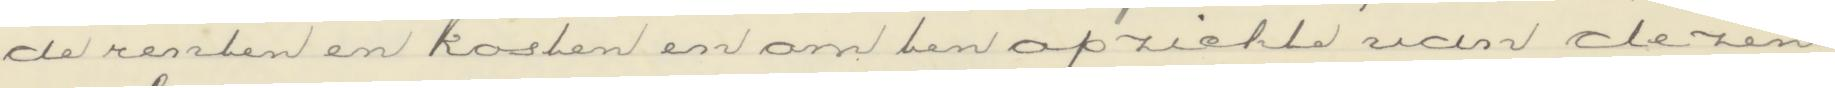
de renten en kosten en om ten opzichte van dezen
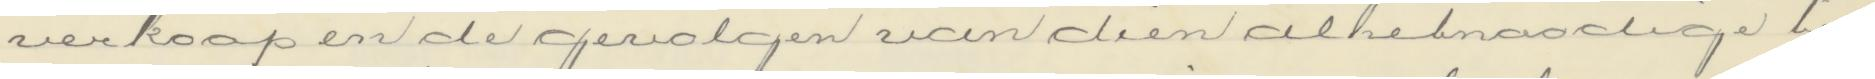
verkoop en de gevolgen van dien al het noodige te
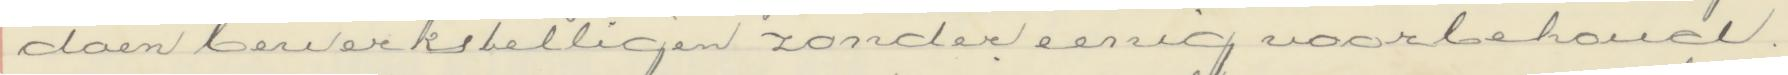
doen bewerkstelligen zonder eenig voorbehoud.
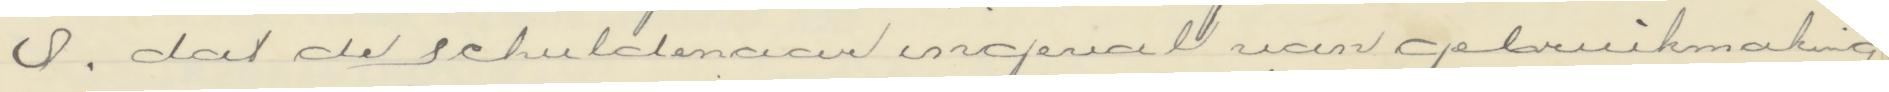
8. dat de schuldenaar ingeval van gebruikmaking
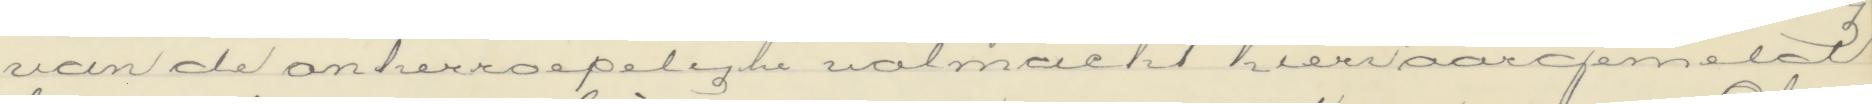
van de onherroepelijke volmacht hiervoorgemeld
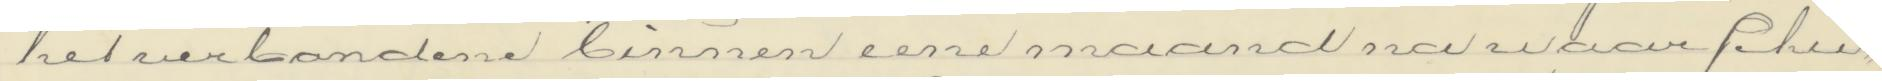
het verbondene binnen eene maand na waarschu„
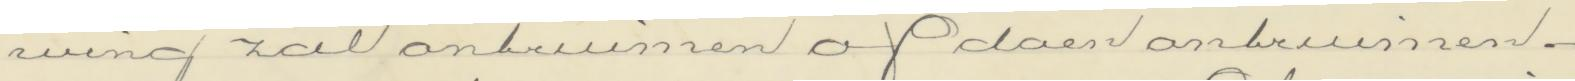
wing zal ontruimen of doen ontruimen
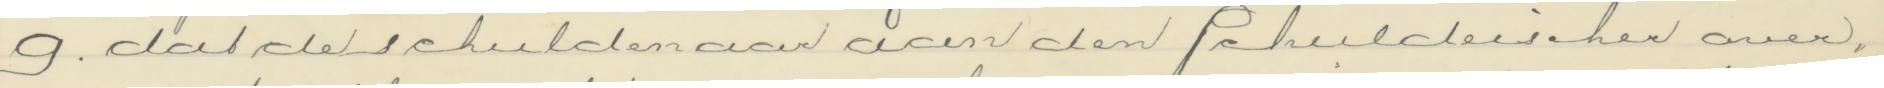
9. dat de schuldenaar aan den schuldeischer over„
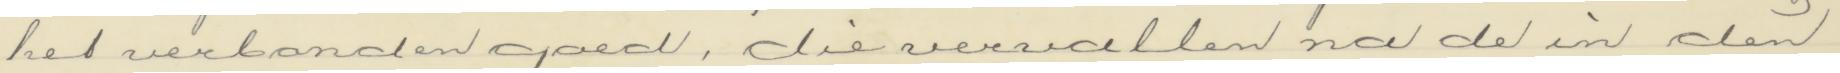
het verbonden goed, die vervallen na de in den
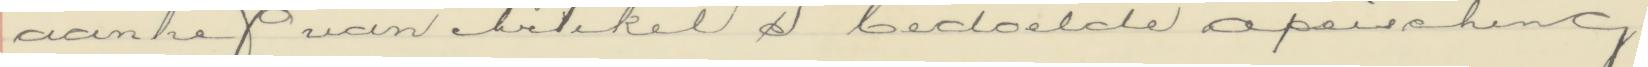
aanhef van Artikel 5 bedoelde opeisching
